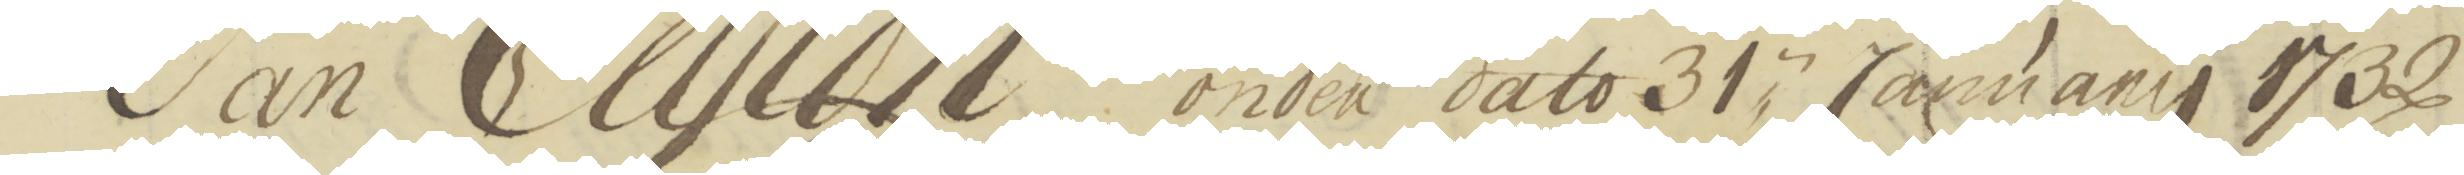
Van Ceijlon onder dato 31„e January 1732
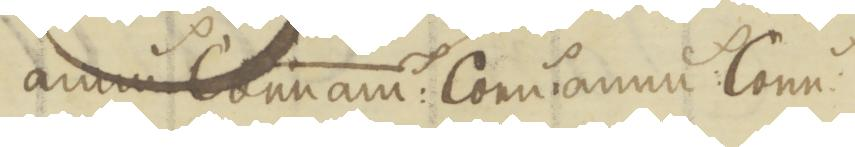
amm:s Cornam:s Corn:s amm:s Corn:s
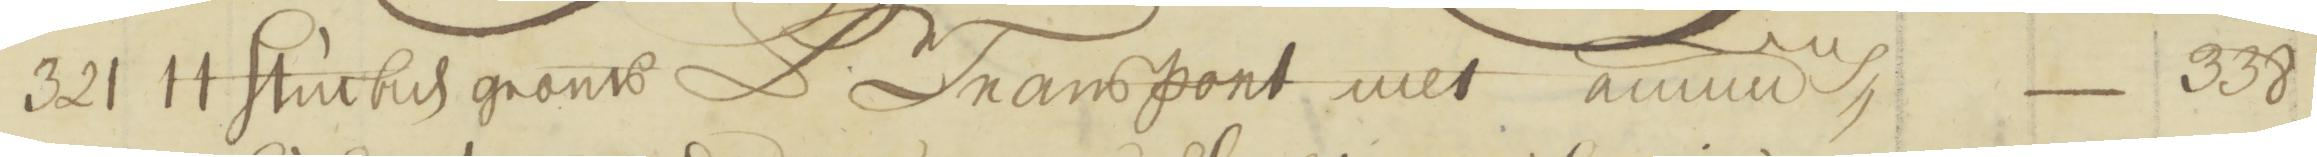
321 11 stucken gronts P.r Transport met ammn„ns „ — 338:
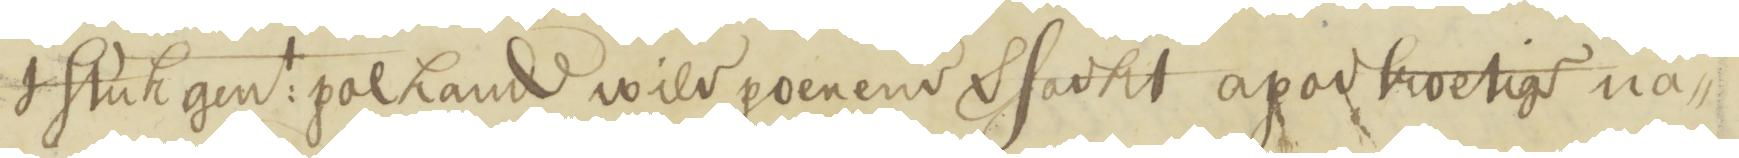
1 stuk gen:t polkande wile poerene versoekt apoekoetige na„
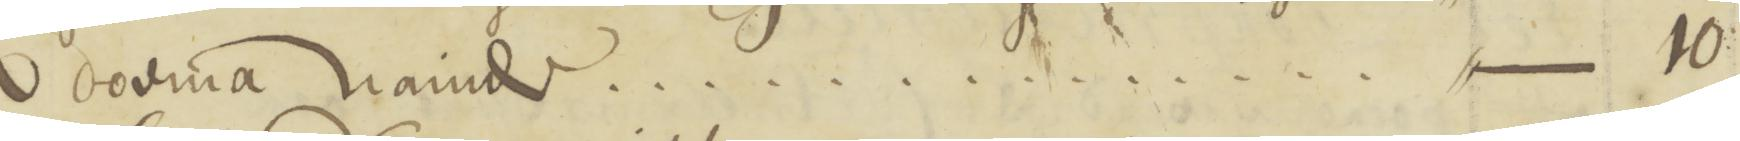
doema nainde . . . . . . . . . . . . . . „ —10:
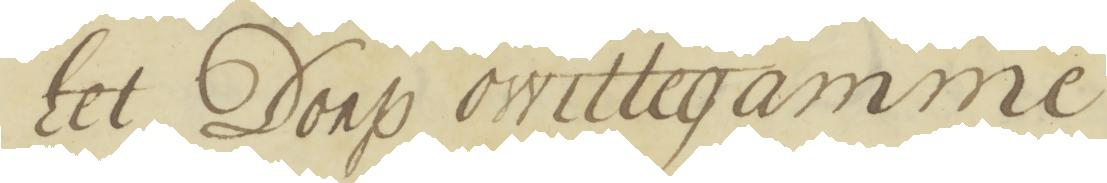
het Dorp owittegamme
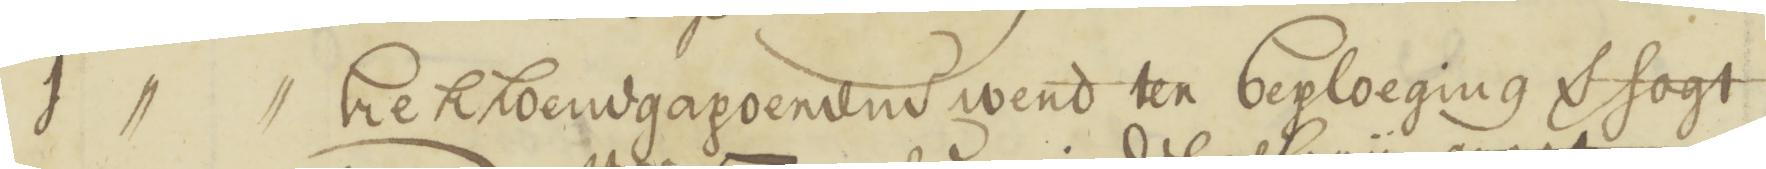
1„ „ kekhoenegapoerene werd ter beploeging versogt
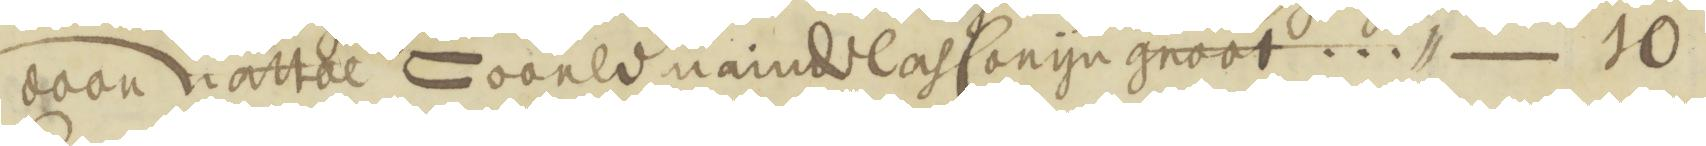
door nattoe Coorle nainde lascorijn groot . . . „ — 10
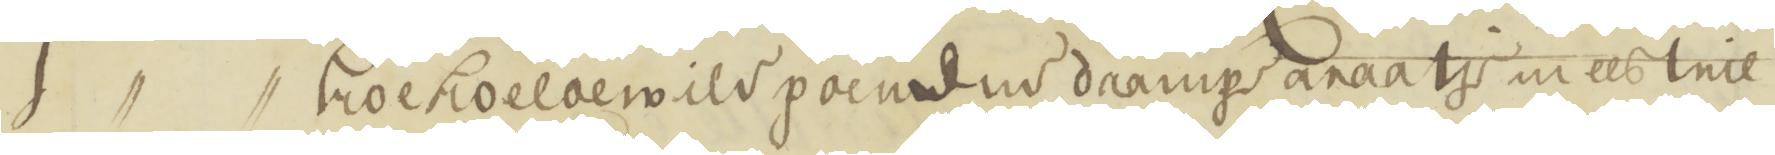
1 koekoeloewile poerene daampe araatje in eestrie
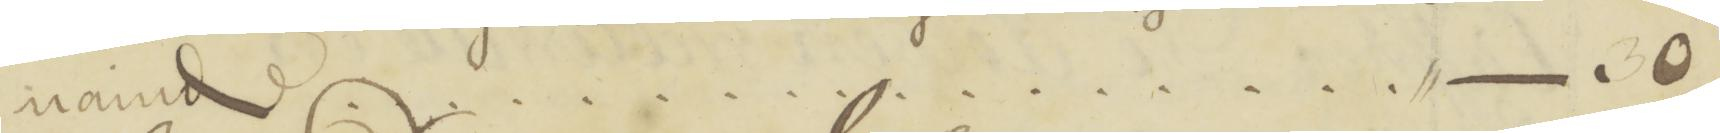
nainde . . . . . . . . . . . . . . . . . „ — 30
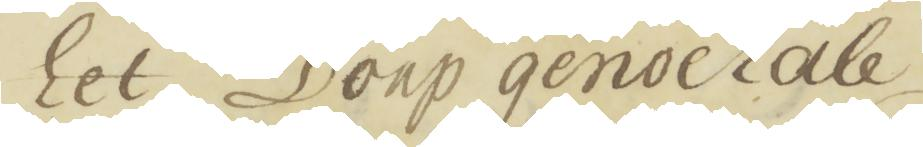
het Dorp genoehale
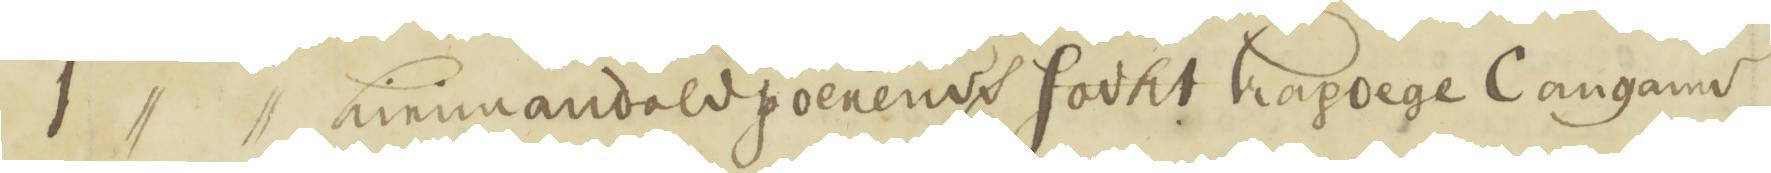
1 „ „ hirimandole poerene versoekt kapoege Cangame
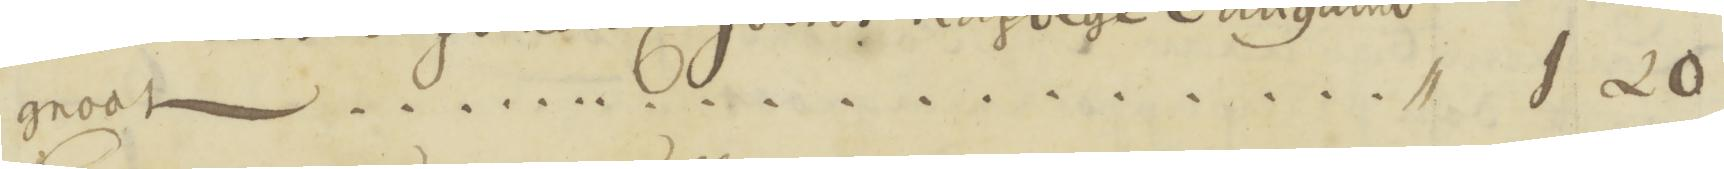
groot . . . . . . . . . . . . . . . . . . . „ 1 20
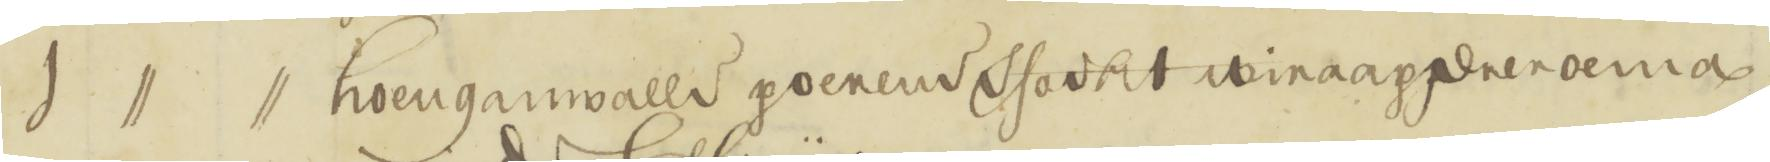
1„ „ hoenganwalle poerene versoekt wiraappereroema
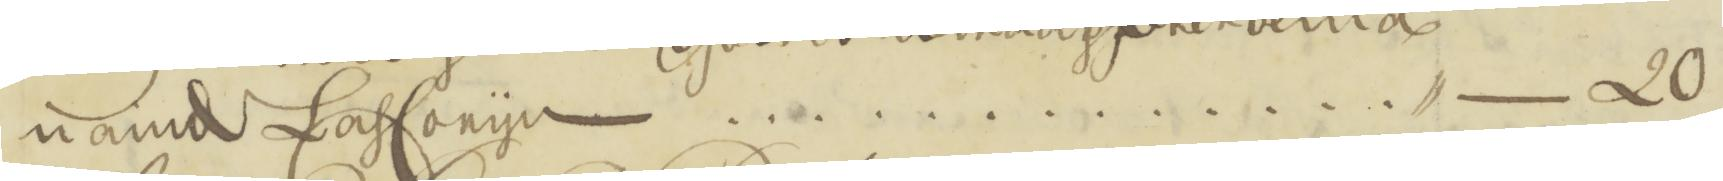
nainde Lascorijn. . . . . . . . . . . . . . „ — 20
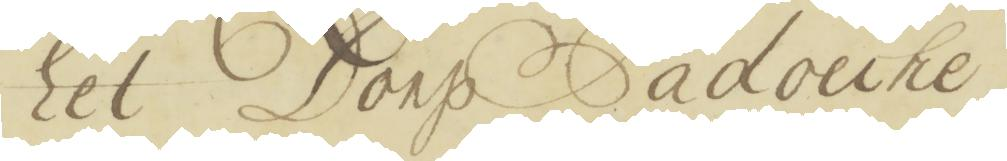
het Dorp Padoecke
